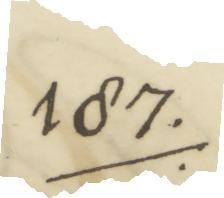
187:
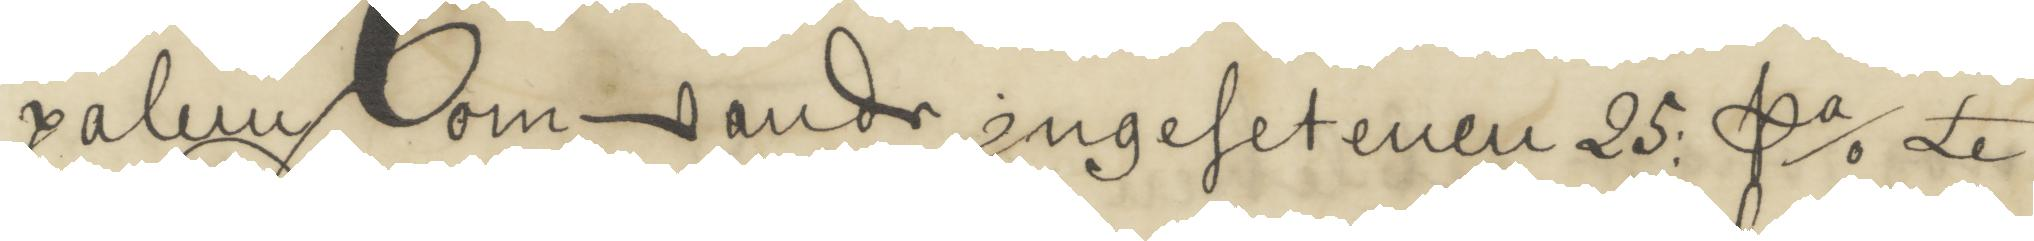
palem om vande ingesetenen 25: p/oa te
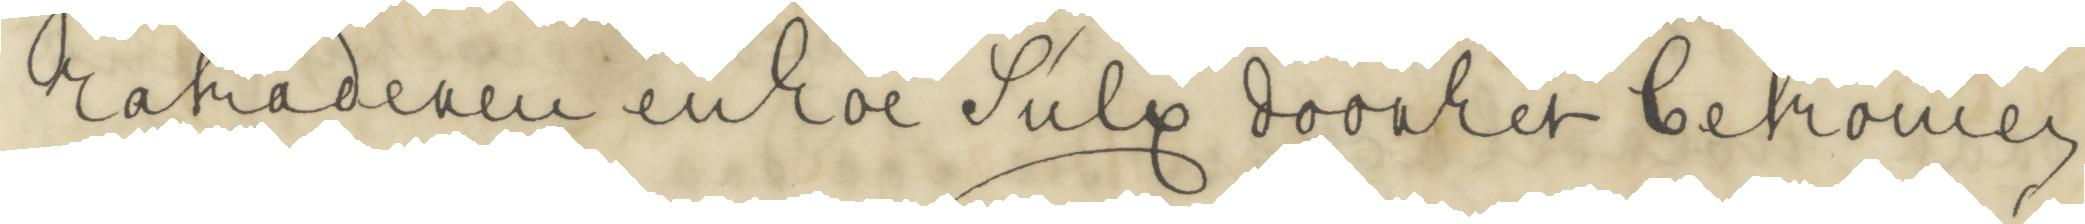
rakaderen enhoe sulx doorhet bekomen
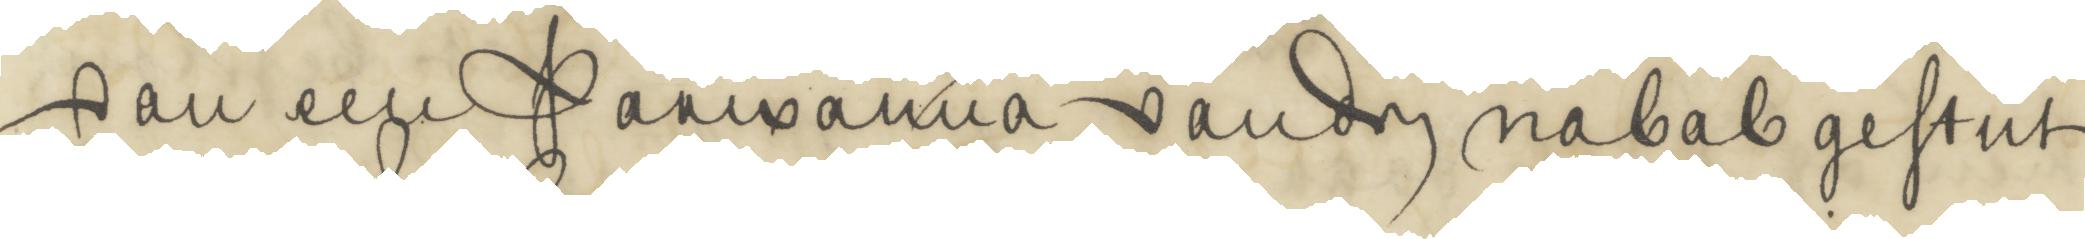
van een Parwanna vanden nabab gestut
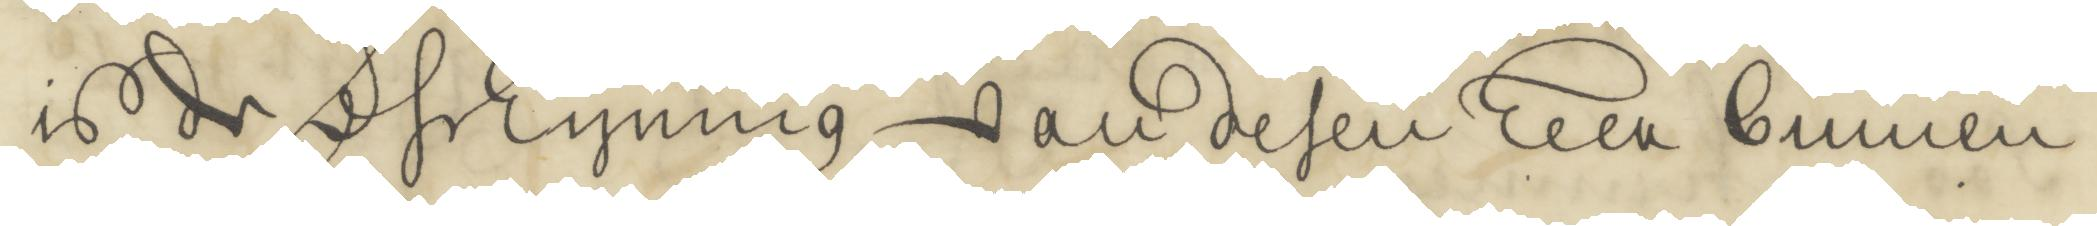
is de verschijning van desen heer binnen
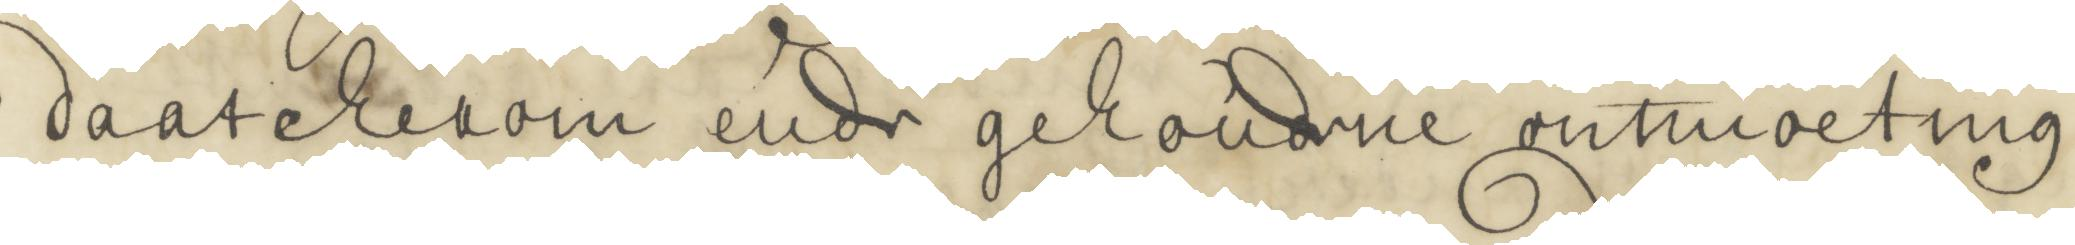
daateherom ende gehoudene ontmoeting
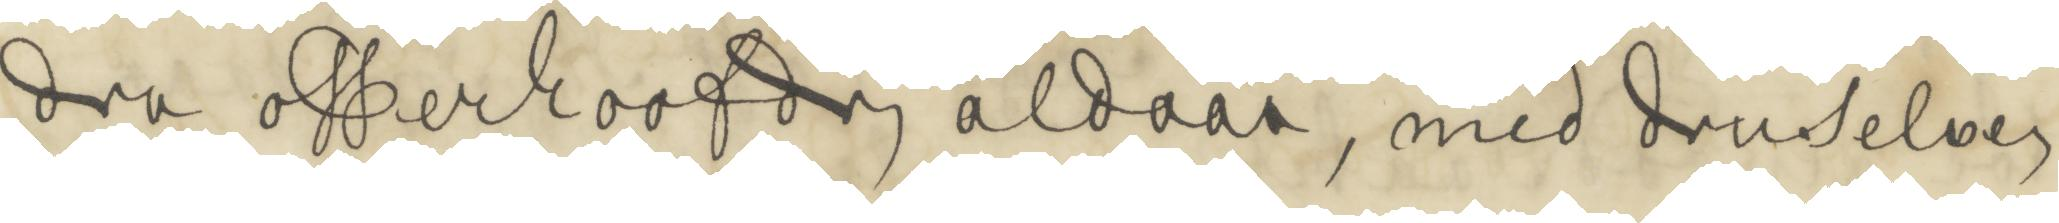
der opperhoofden aldaar, med denselven
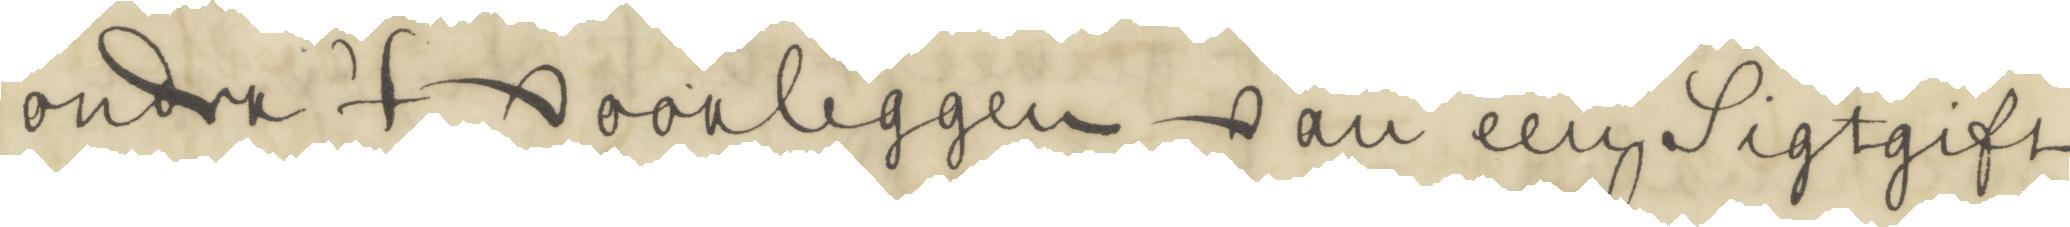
onder ’t voorleggen van een sigtgift
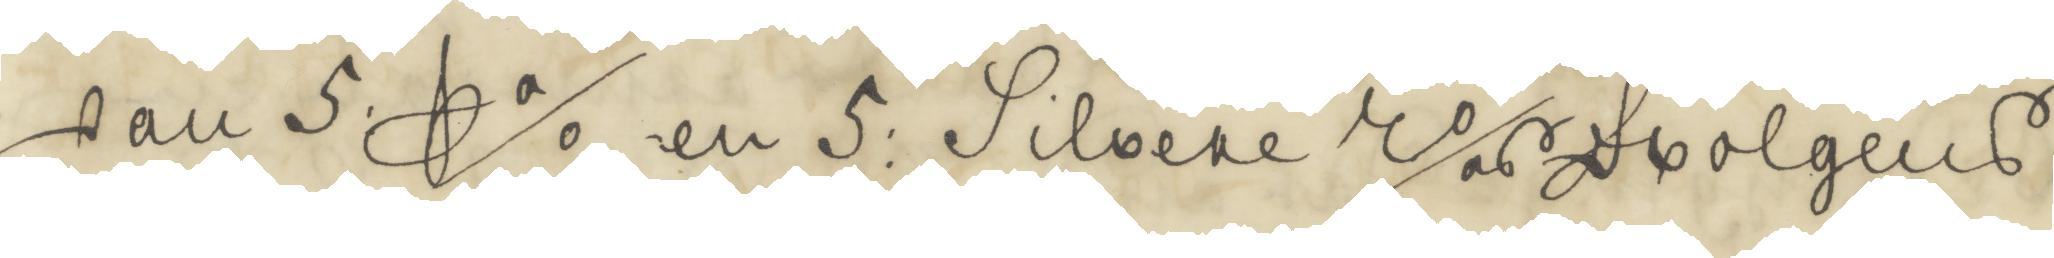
van 5. p/oa, en 5: silvere r/aso vervolgens
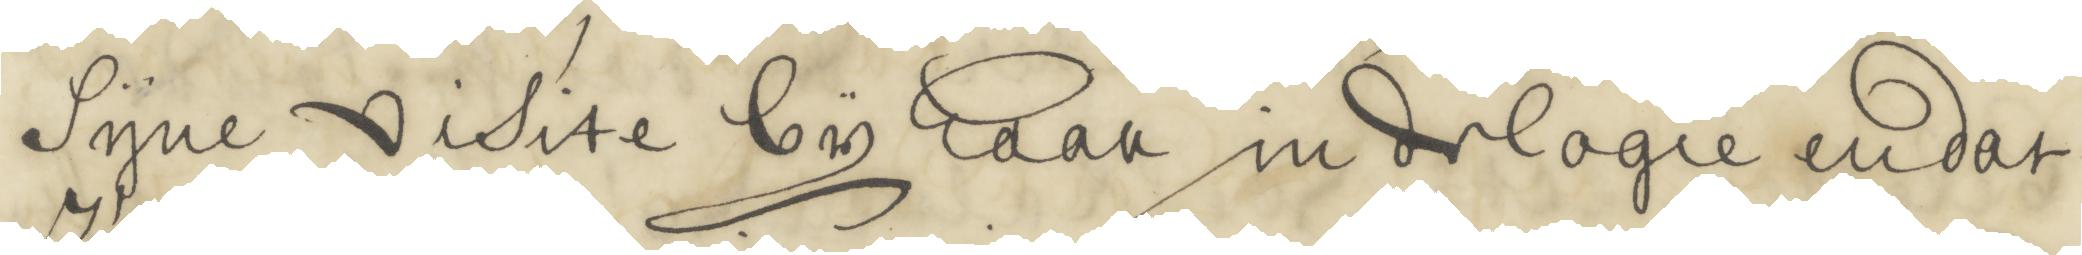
sijne visite bij haar in delogie en dat
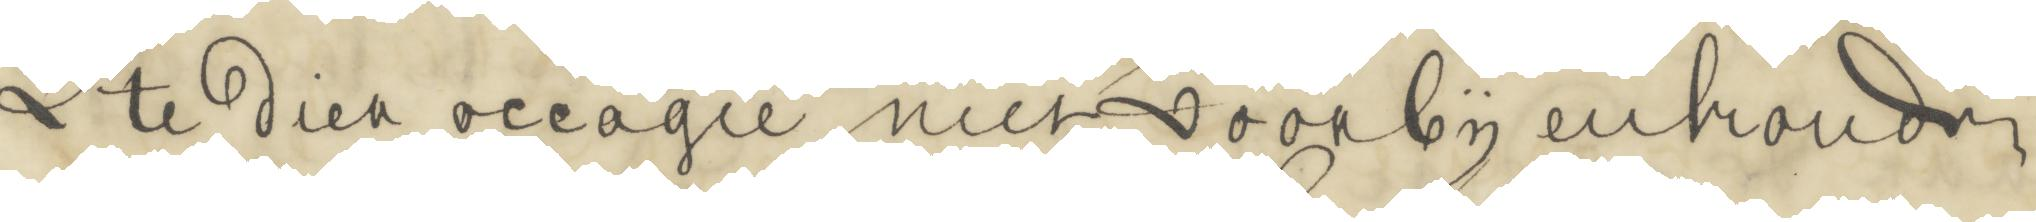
z' te dier occagie niet voor bij en konden
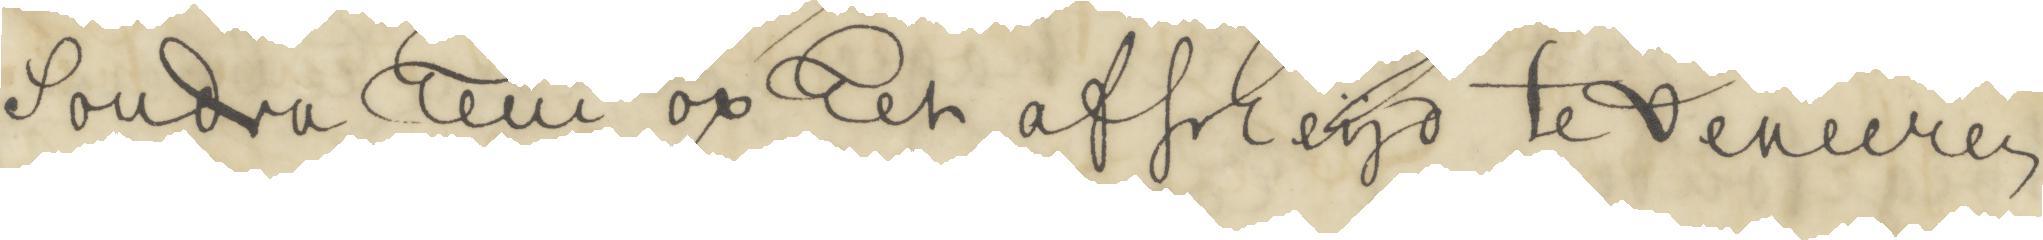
sonder hem op het afscheijd te vereeren
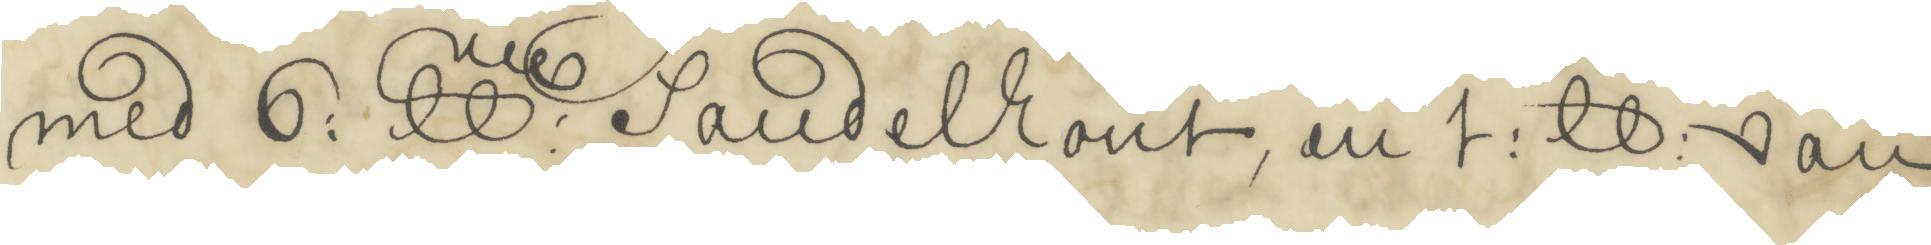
med 6: lb: sandelhout, en 1: lb: van
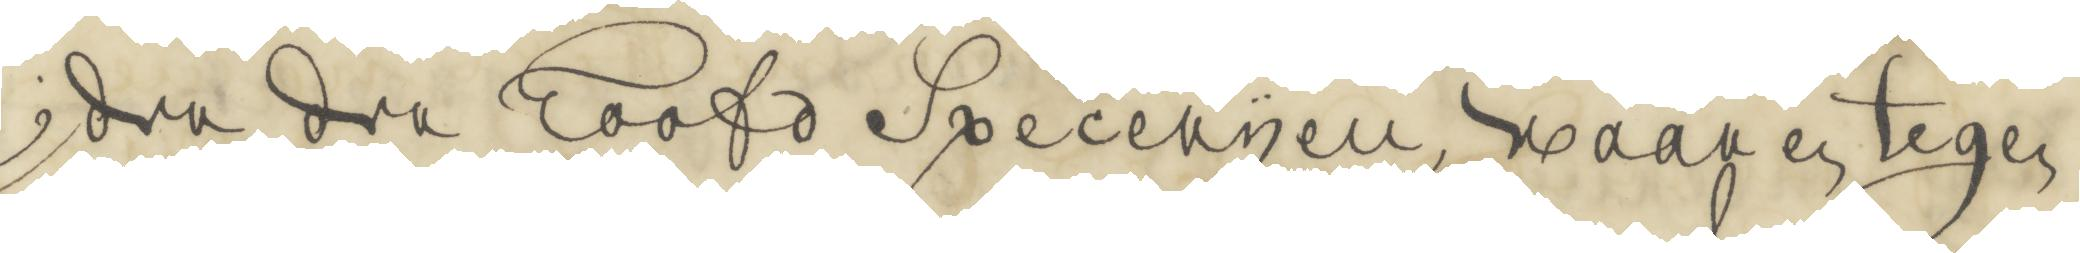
jder der hoofd specerijen, waar en tegen
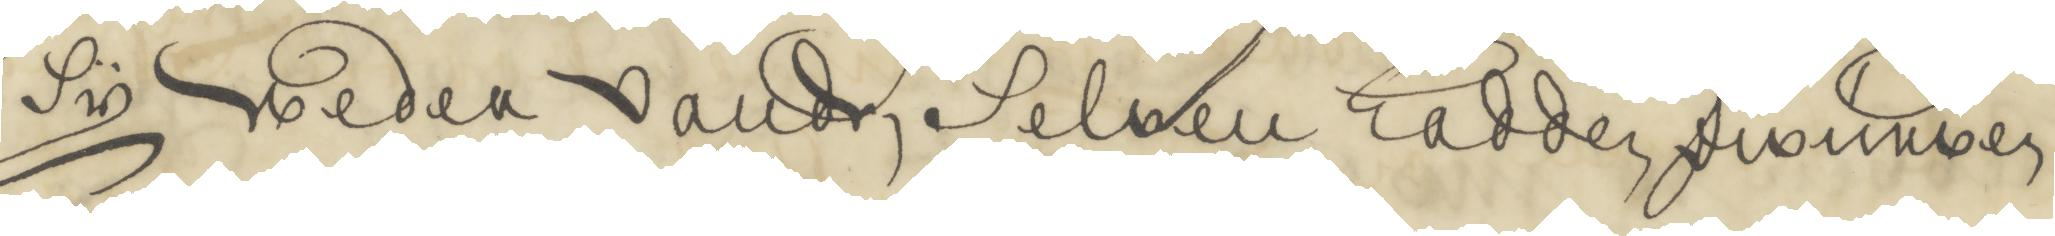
sij weder vande, selven hadden verwurven
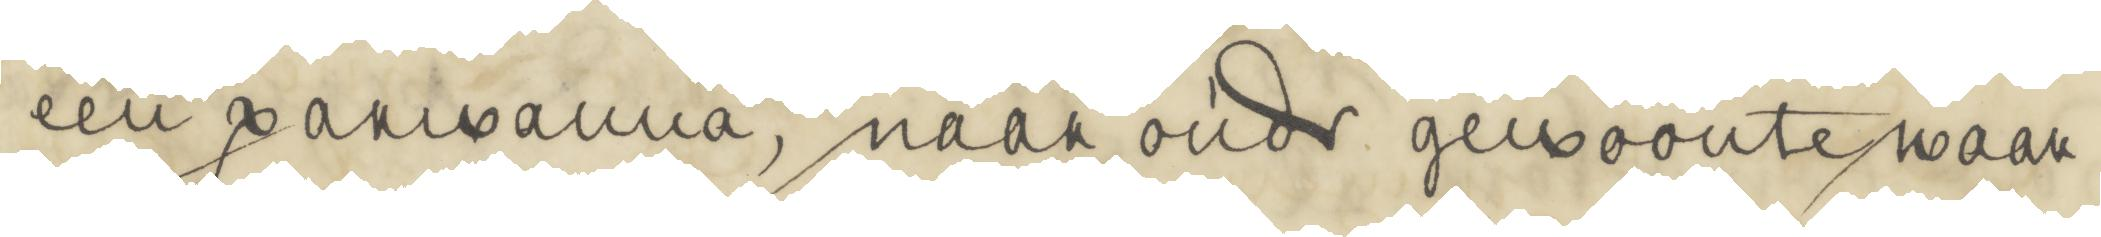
een parivanna, naar oude gewoonte waar
